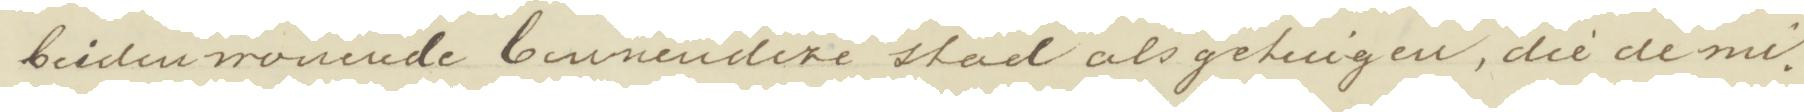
beiden wonende binnen deze stad als getuigen, die de mi,
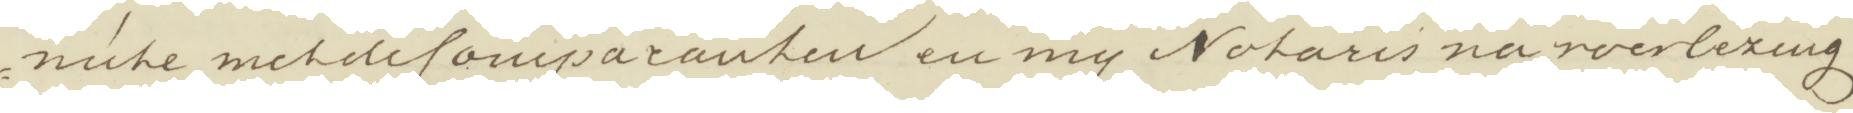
nute met de Comparanten en my Notaris na voorlezing
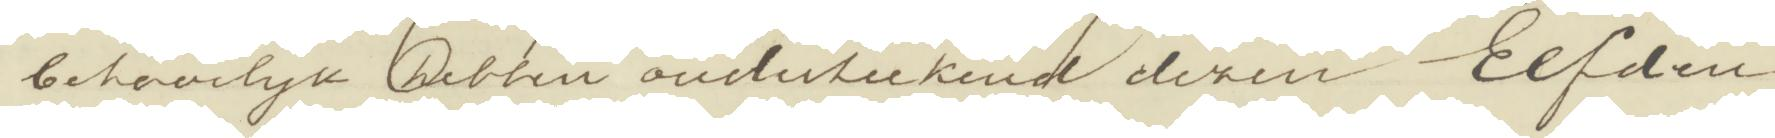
behoorlyk hebben onderteekend dezen Elfden
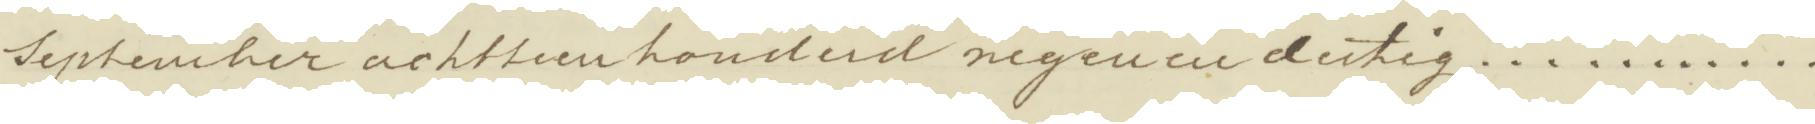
September achttienhonderd negenendertig. . . . . . . . . . .
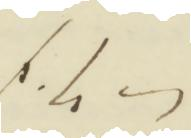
ƒ. 4 -
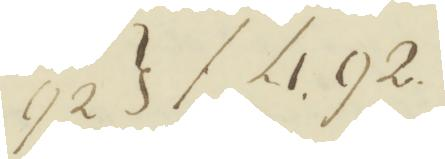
92 ƒ4.92.
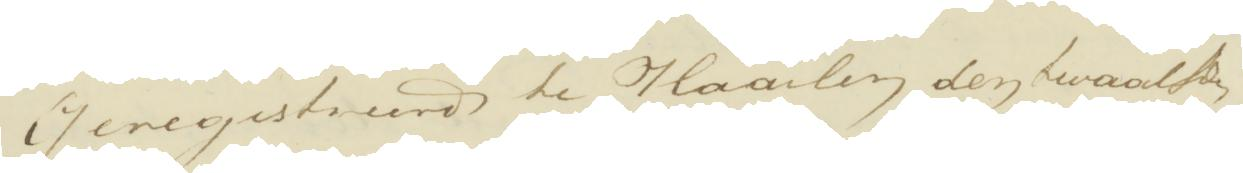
Geregistreerd te Haarlem den twaalfen
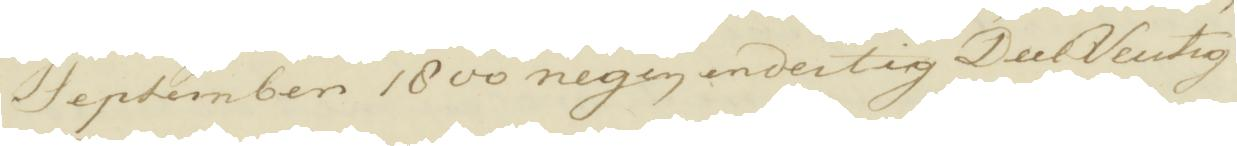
september 1800 negen endertig Deel Veertig
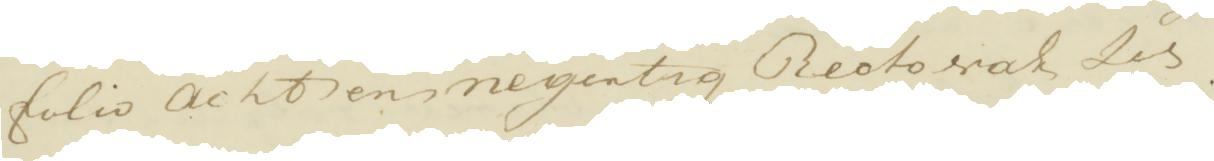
folio achten negentig Recto vak zes
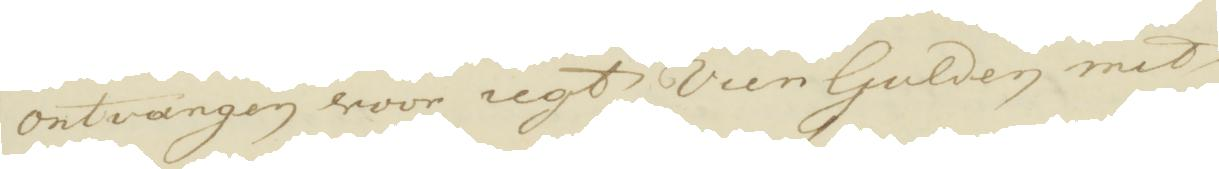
ontvangen voor regt vier Gulden met
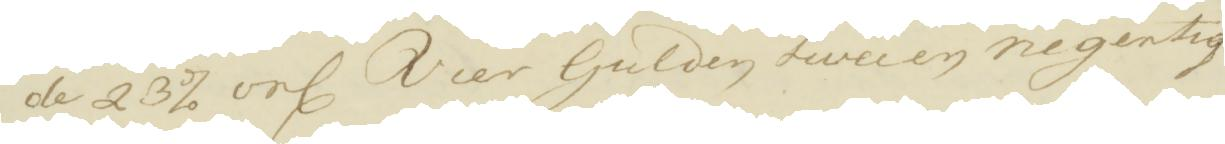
de 23% opc Vier Gulden twee en negentig
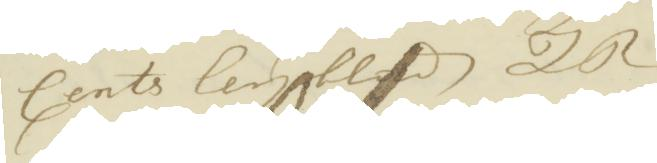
Cents Een blad ZR
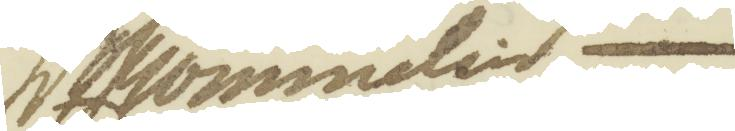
DFCrommelin.—
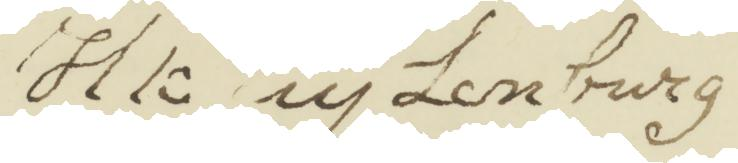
Hk Uylenburg
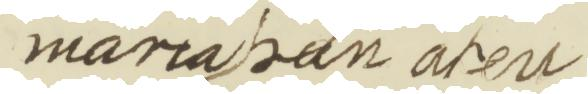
maria van aken
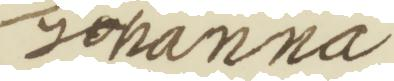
Iohanna
